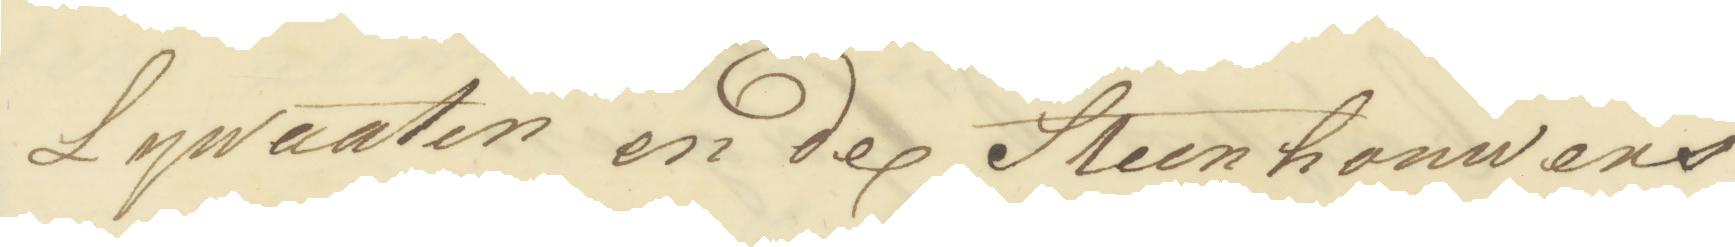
Lywaaten en de steen houwers
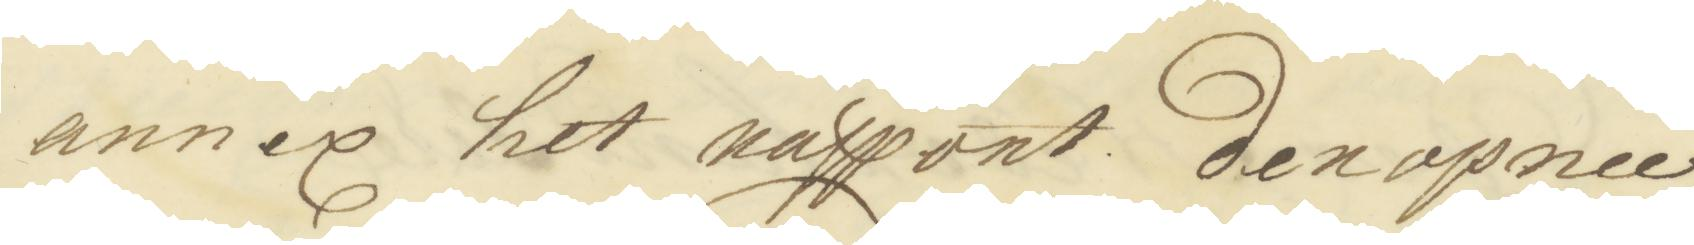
annex het rapport der opnee,
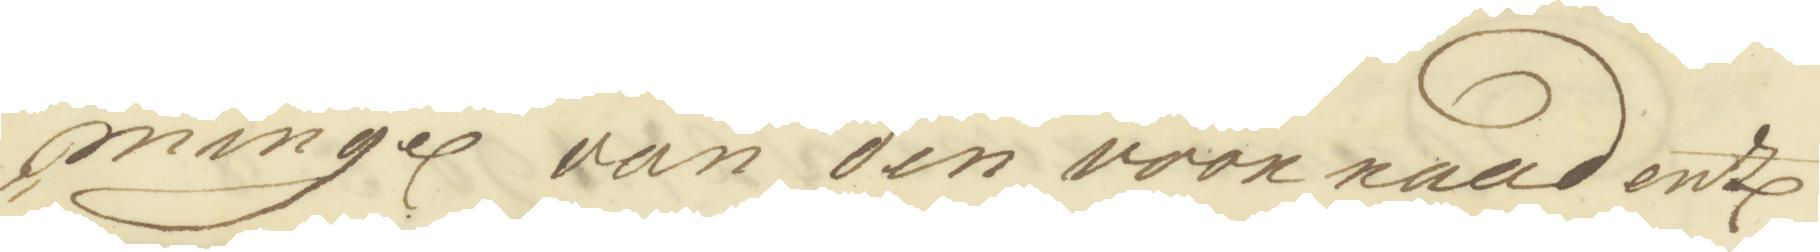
„minge van den voor raad enz
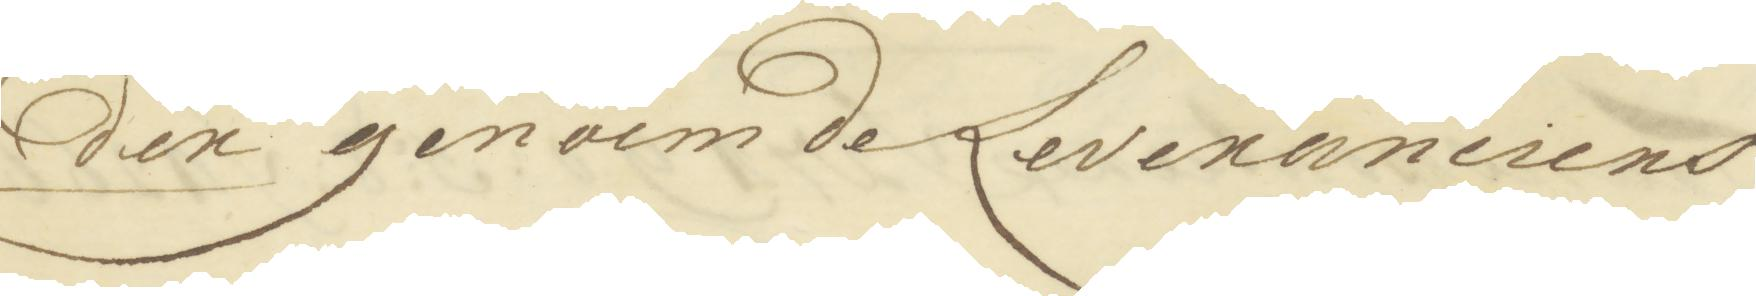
der genoemde Leveranciers
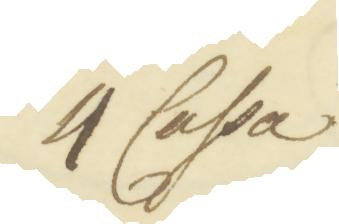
4 Cassa
